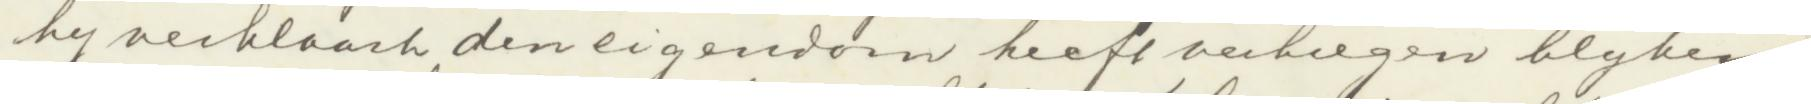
hy verklaart den eigendom heeft verkregen blykens
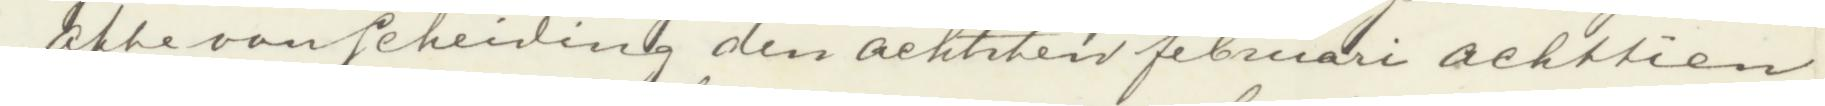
akte van scheiding den achtsten februari achttien
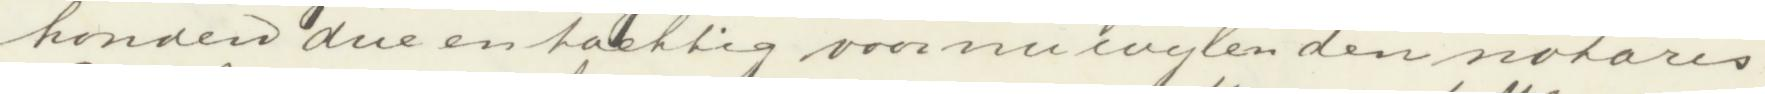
honderd drie en tachtig voor nu wylen den notaris
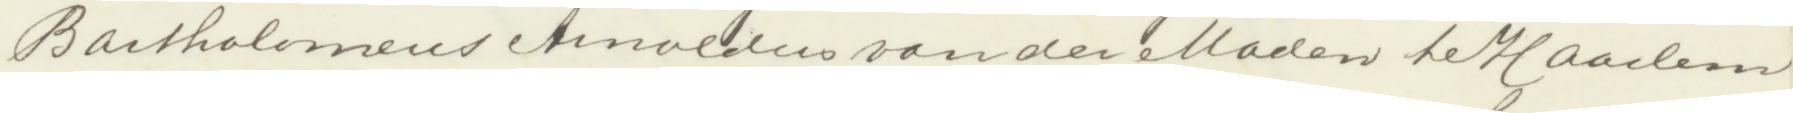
Bartholomeus Arnoldus van der Maden te Haarlem
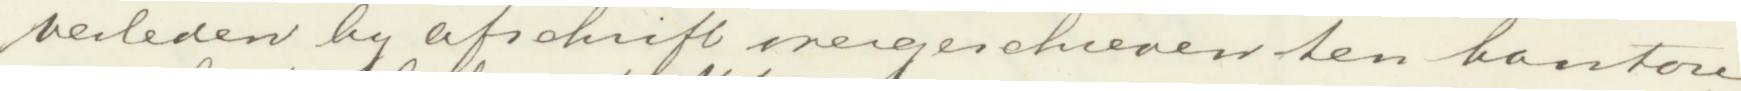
verleden by afschrift overgeschreven ten kantore
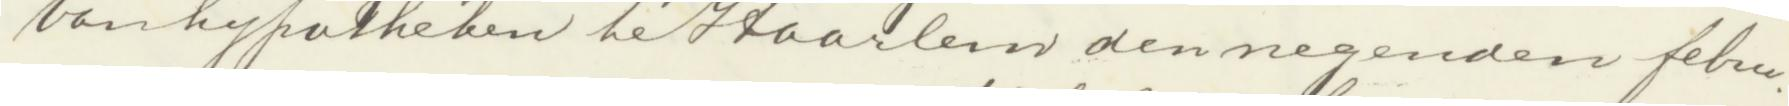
van hypotheken te Haarlem den negenden febru„
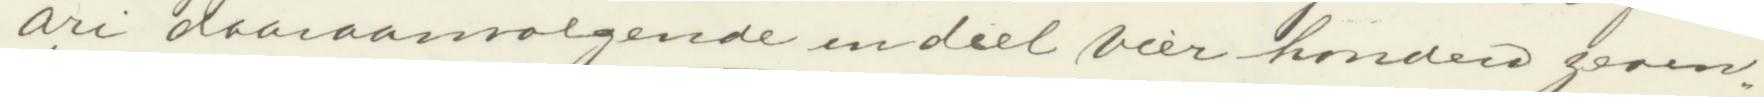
ari daaraanvolgende in deel vier honderd zeven„
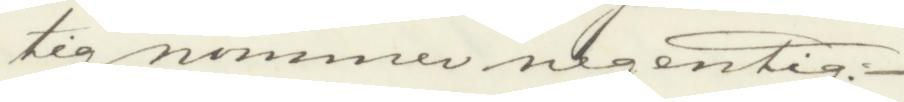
tig nommer negentig.—
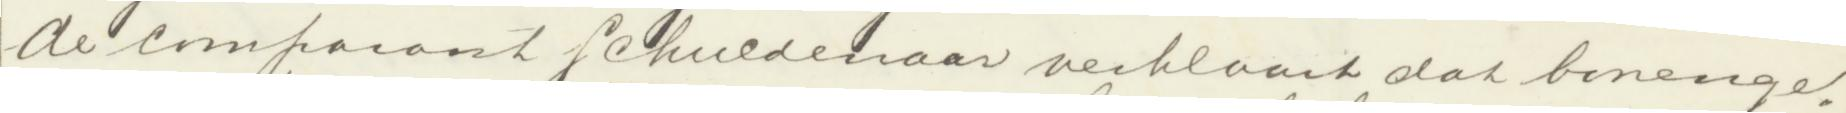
de comparant schuldenaar verklaart dat bovenge„
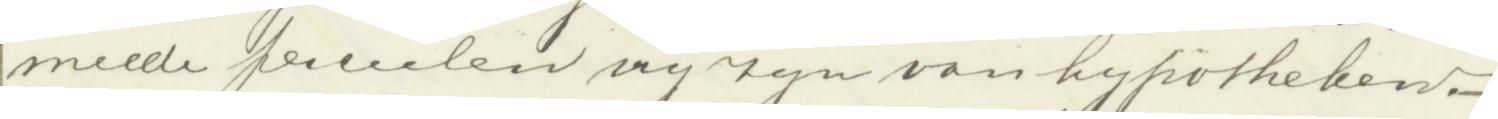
melde perceelen vry zyn van hypotheken.-
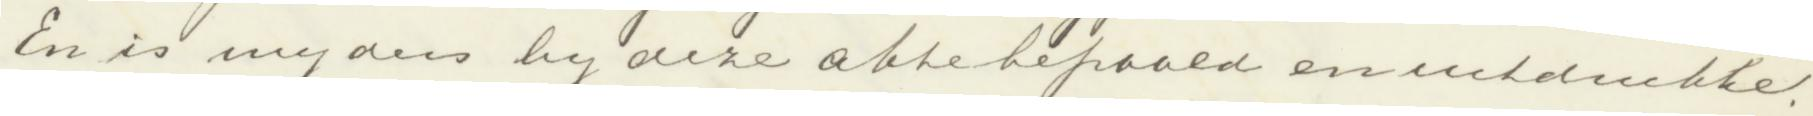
En is wyders by deze akte bepaald en uitdrukke,
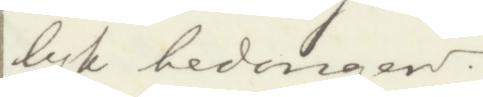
lyk bedongen.
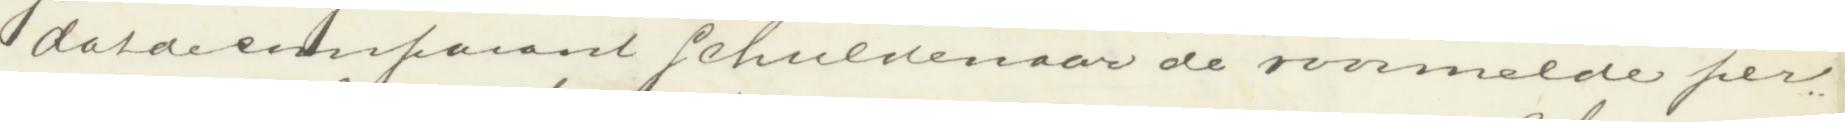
dat de comparant schuldenaar de voormelde per„
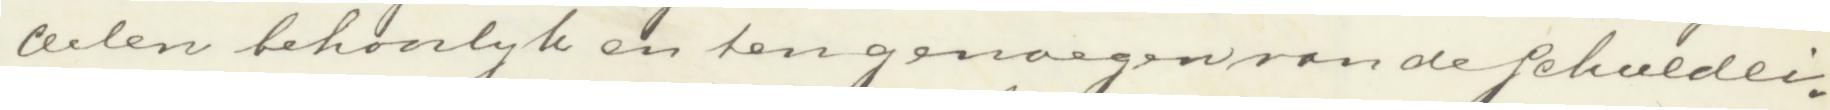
ceelen behoorlyk en ten genoegen van de schuldei„
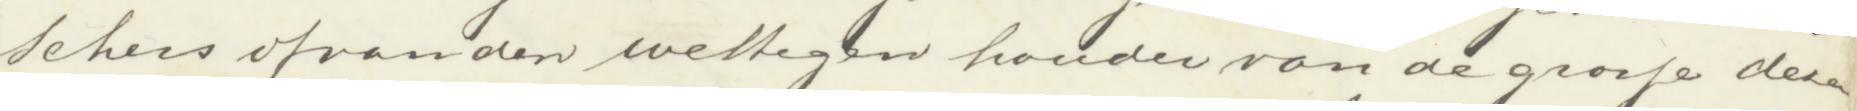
scheis of van den wettigen houder van de grosse dezer
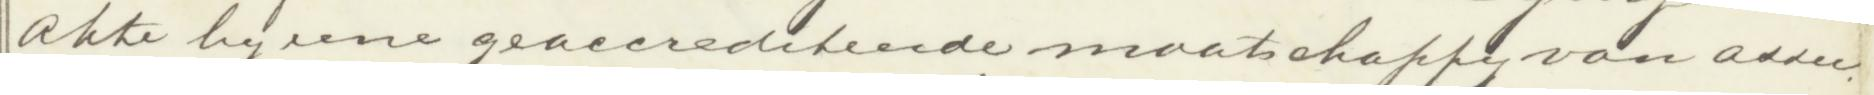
akte by eene geaccrediteerde maatschappy van assu„
